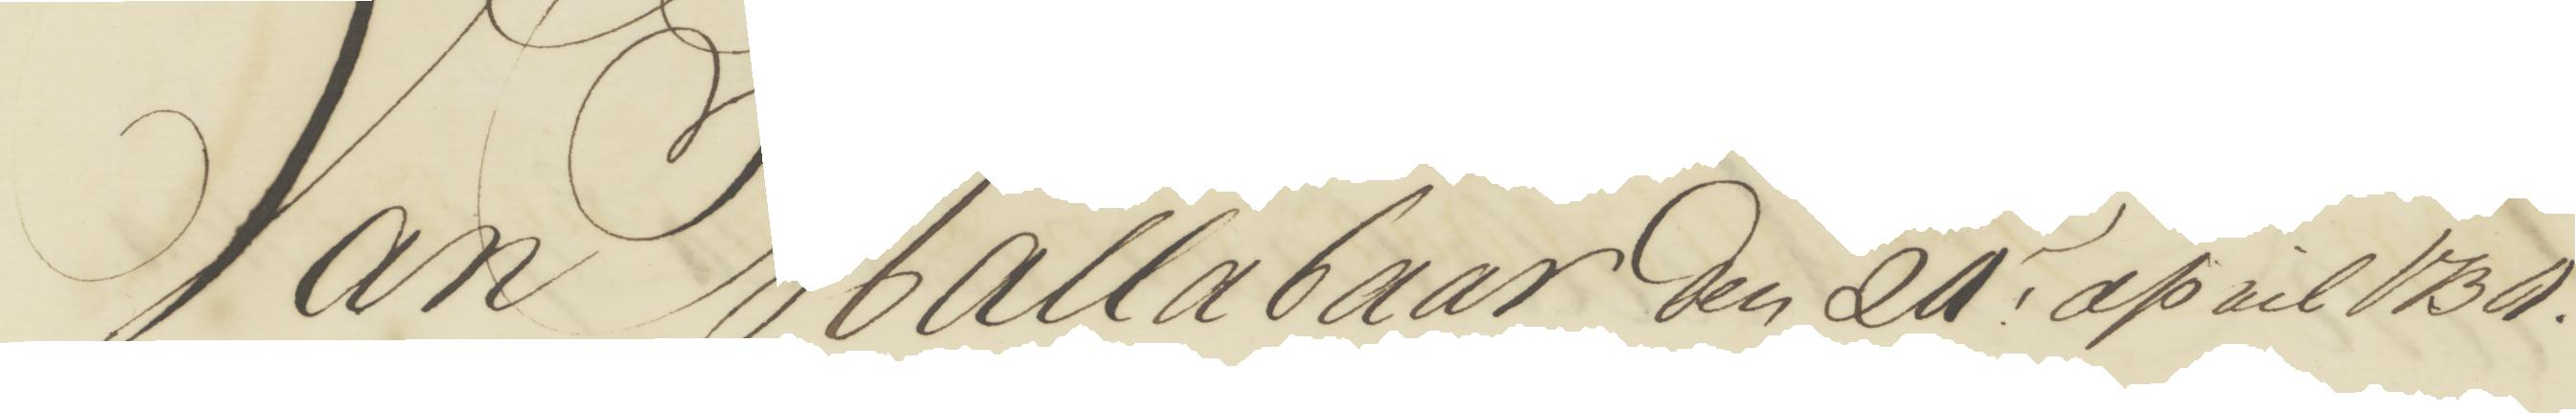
Van Mallabaar den 24:' april 1734.
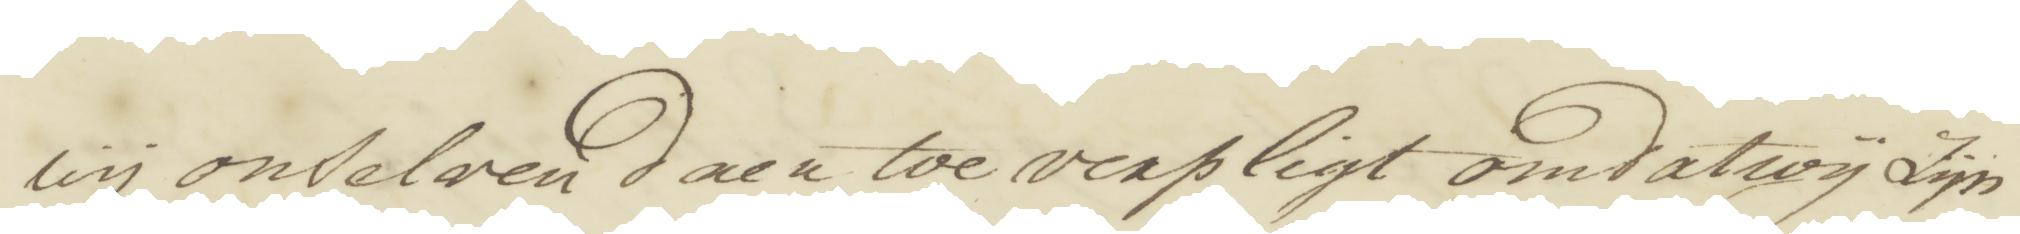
wij onselven daer toe verpligt om dat wij zijn
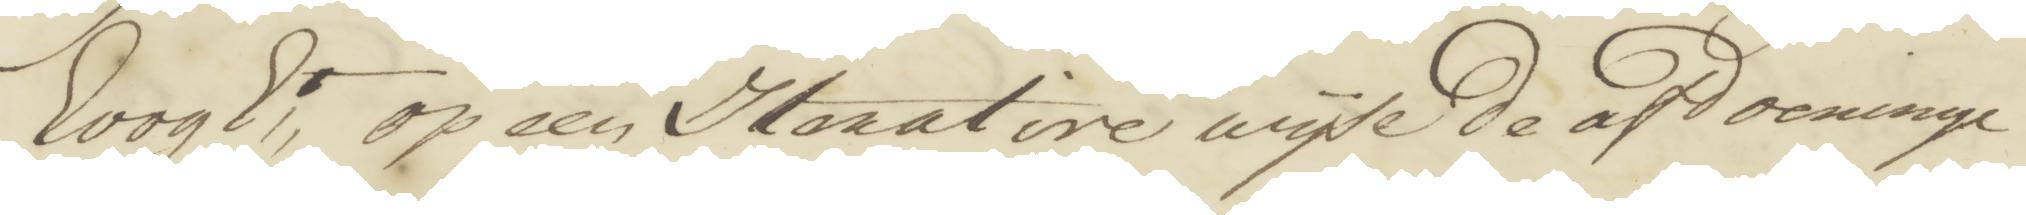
hoogh„t op een Iterative wijse de afdoeninge
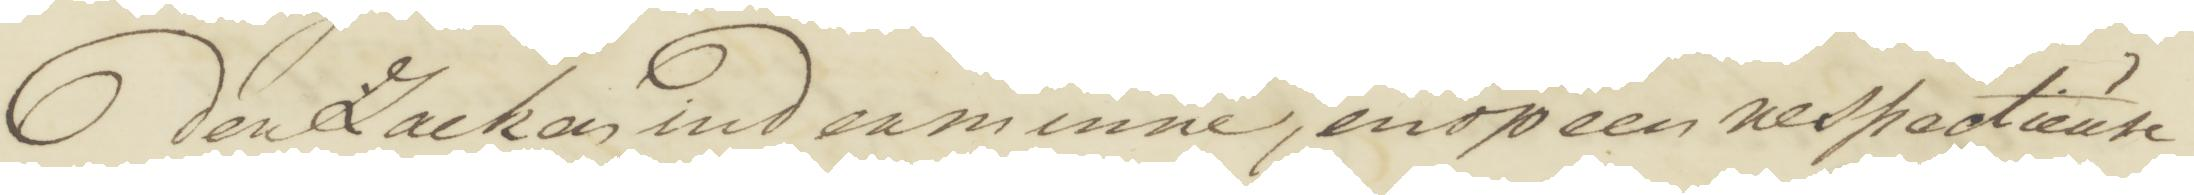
der zaeken inderminne, en op een respectieuse
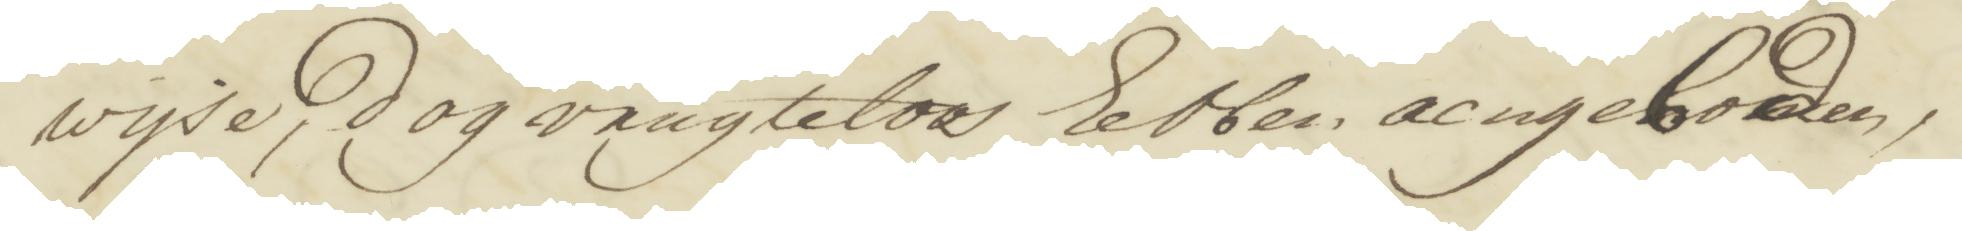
wijse, dog vrugteloos hebben aengeboden,
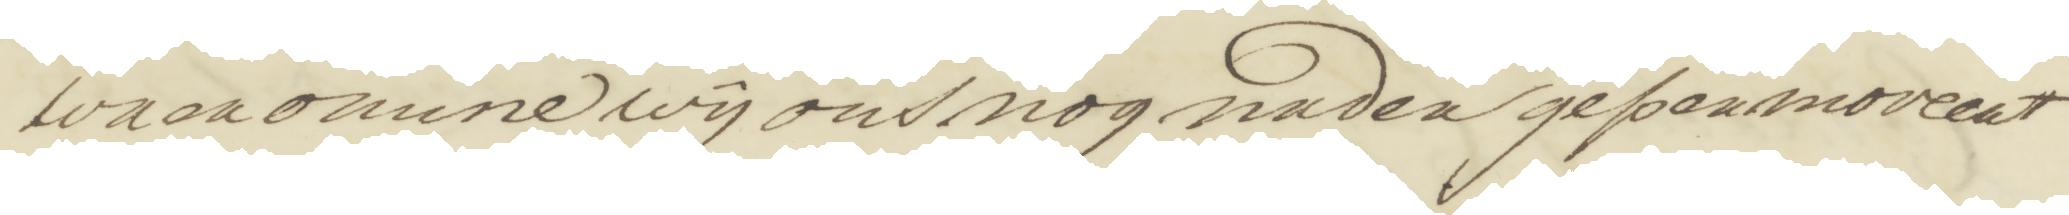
waer omme wij ons nog nader gepermoveert
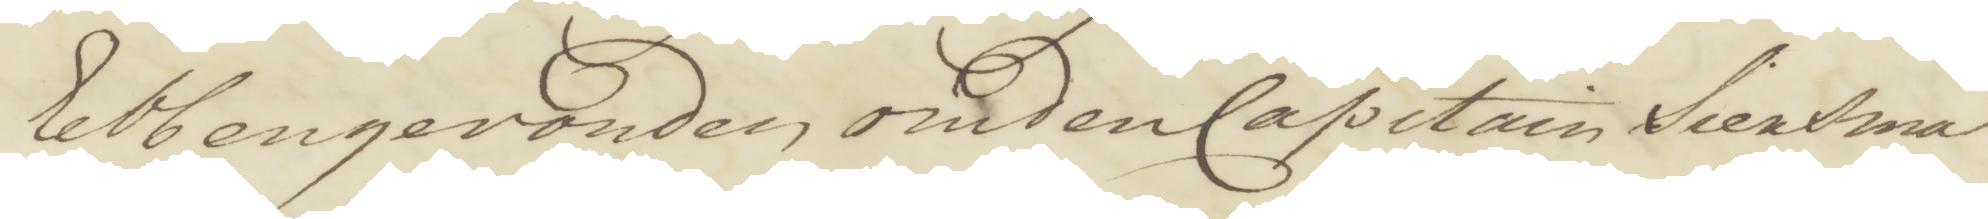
hebben gevonden om den Capitain siersma
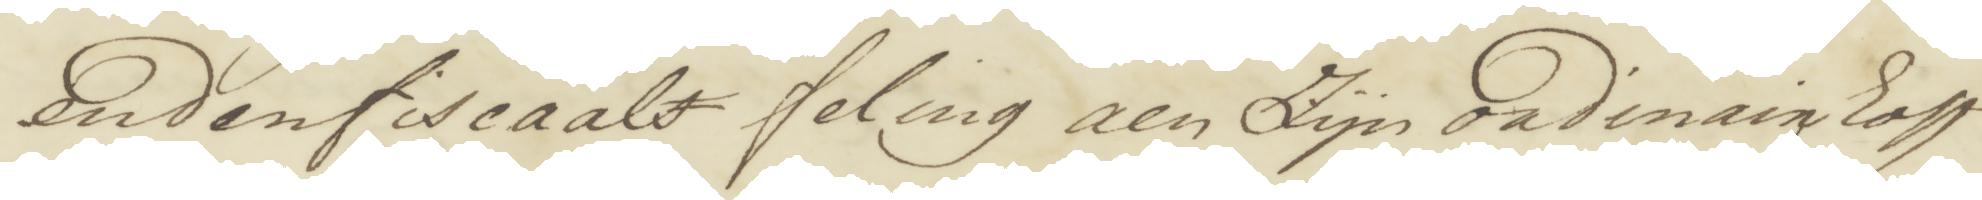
en den fiscaals feling aen zijn ordinair hoff
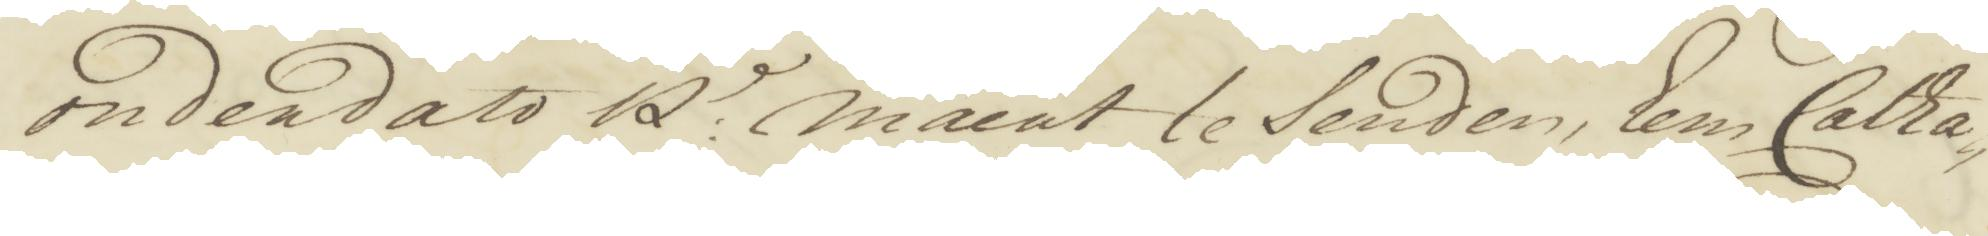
onder dato 12:e maert te senden, hem Catha„
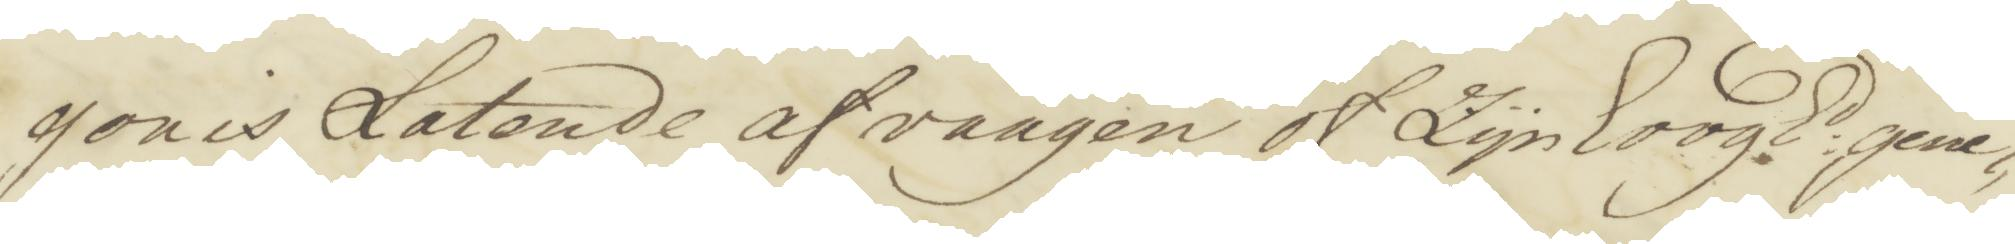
gor is Latende afvragen of zijn hoog E:d gene„
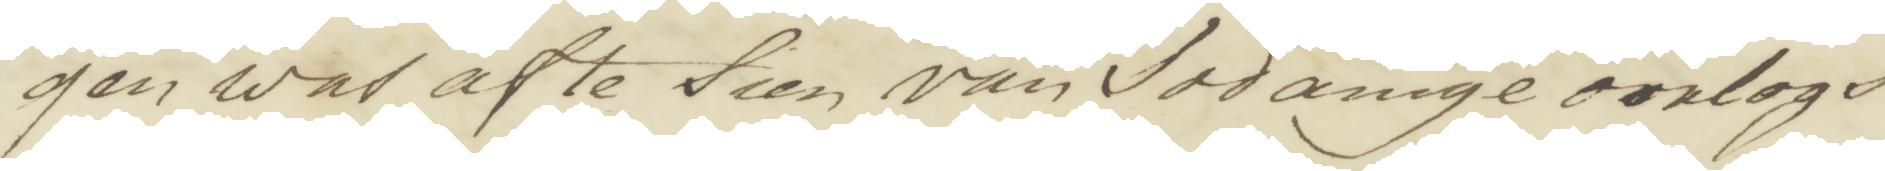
gen was afte sien van sodanige oorlogs
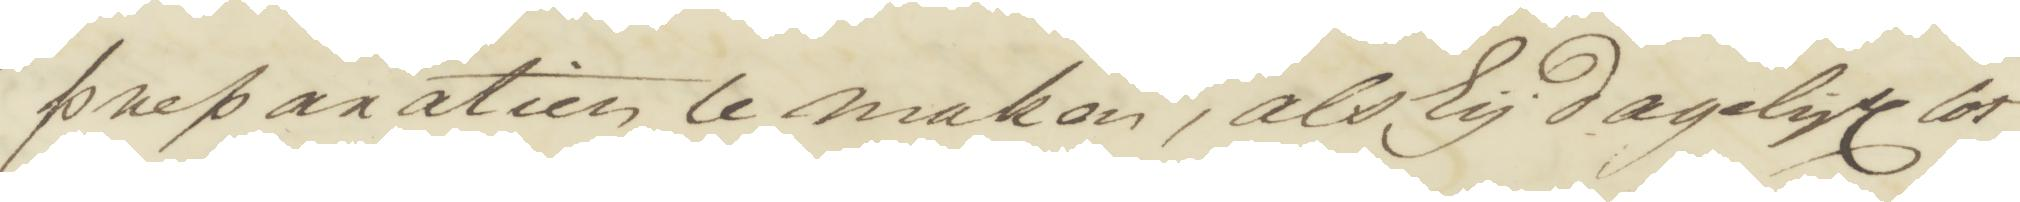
preparatien te maken, als hij dagelijx tot
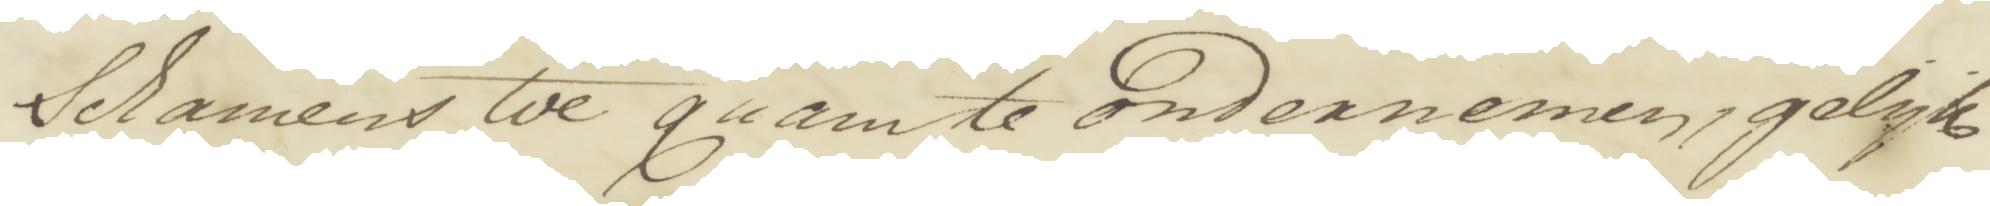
schamens toe quam te ondernemen, gelijk
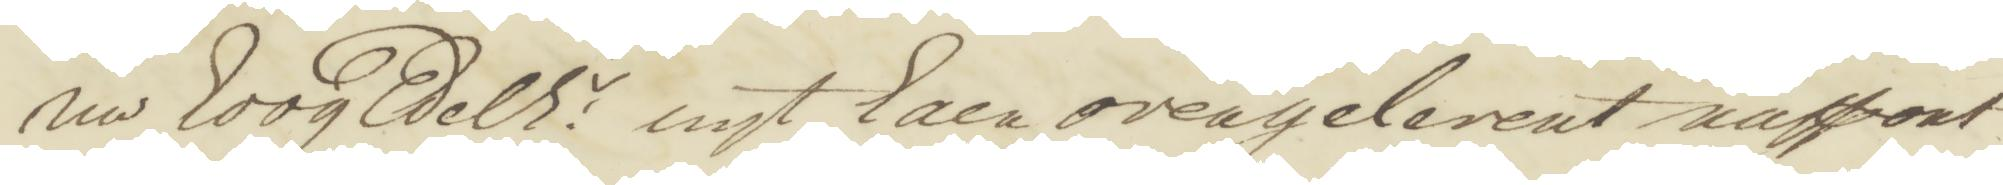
uw hoog Edelh:s uyt haer overgelevert rapport
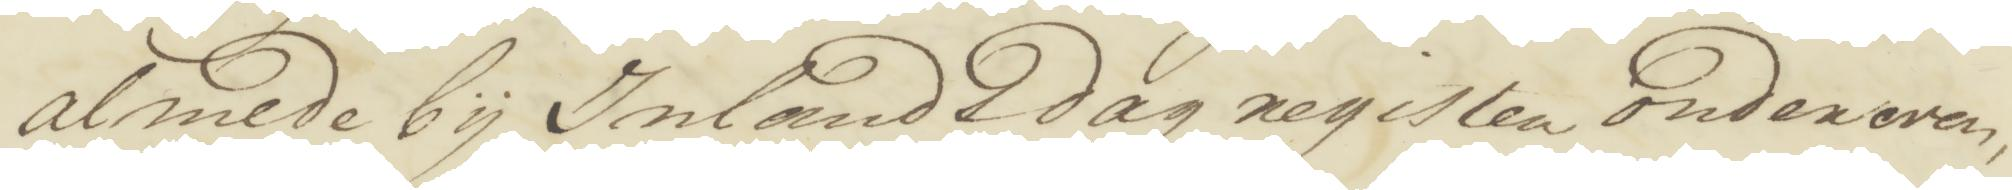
al mede bij Inlands dag register onder even
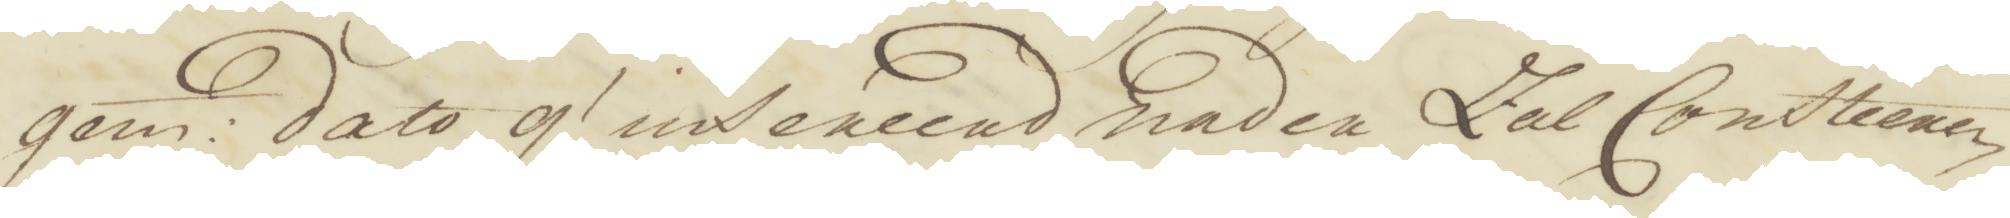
gem: dato g’insereerd, nader zal Consteeren
